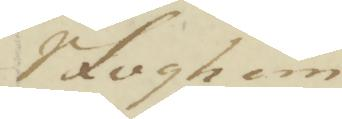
V Loghem
